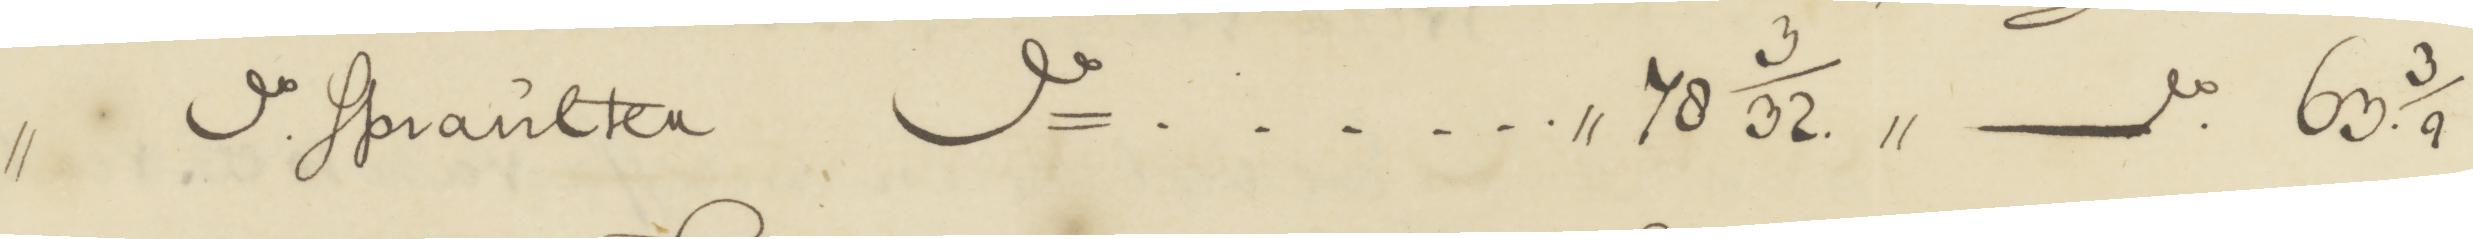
„ d.o spiaulter d=o . - - - - . „ 78 3/32. „ _.o 63.¾
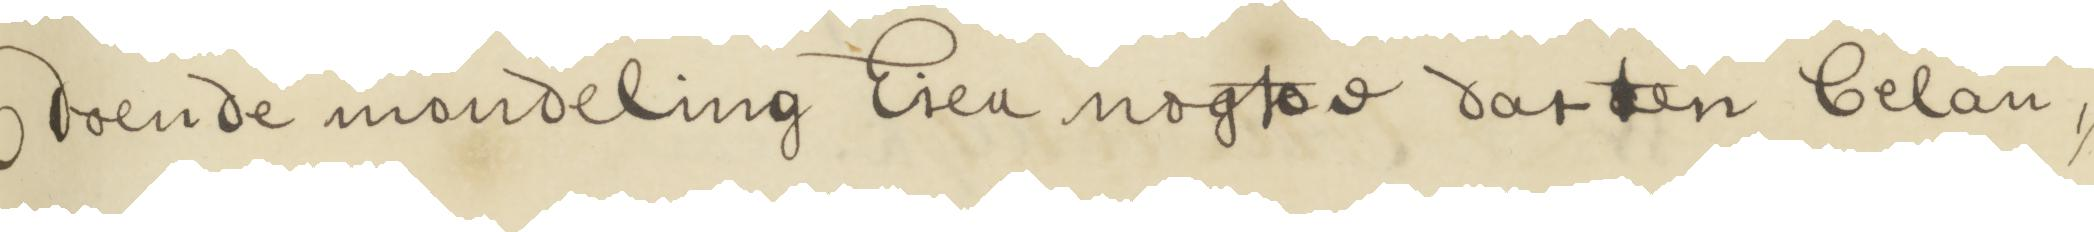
doende mondeling hier nogtoe dat ten belan„
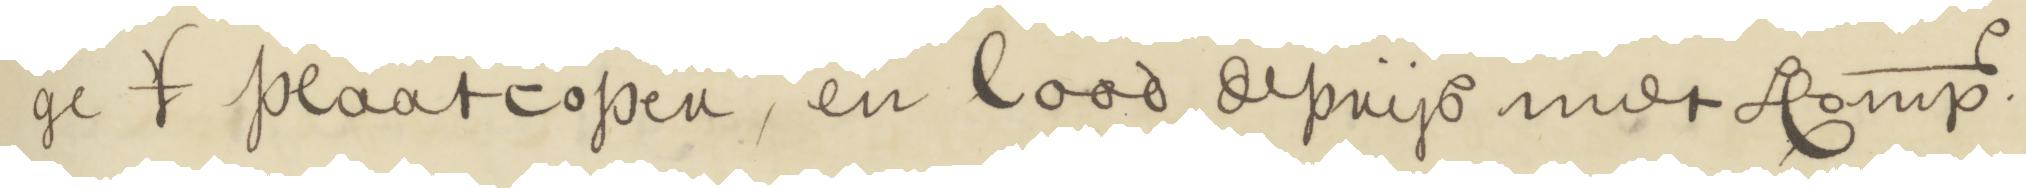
ge ’t plaatcoper, en lood deprijs met sComp.s
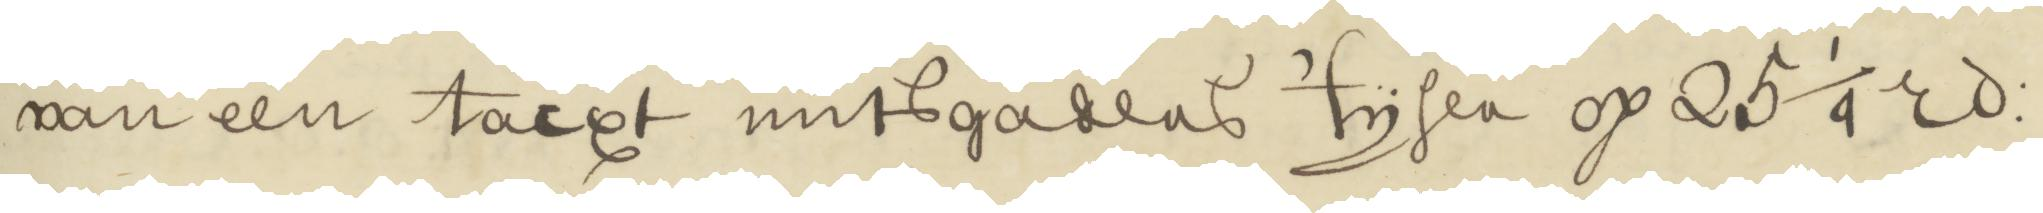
van een tacxt mitsgaders 'tijser op 25¼ rd:
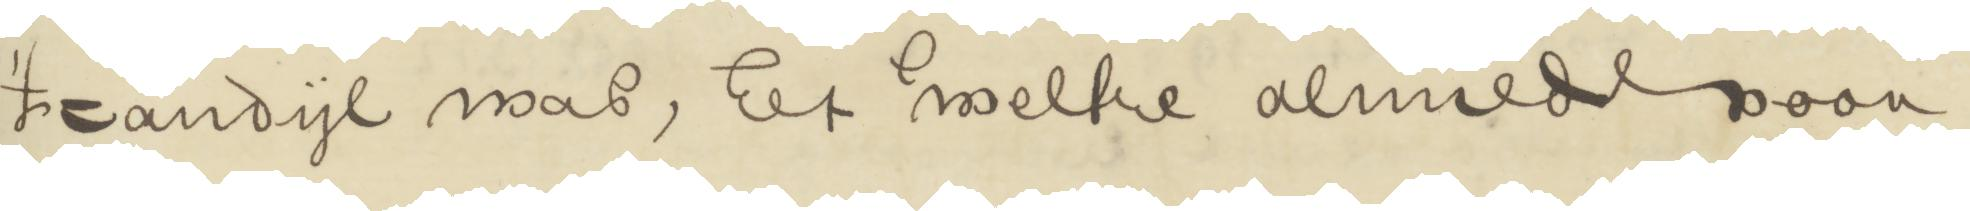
t candijl was, het welke almede voor
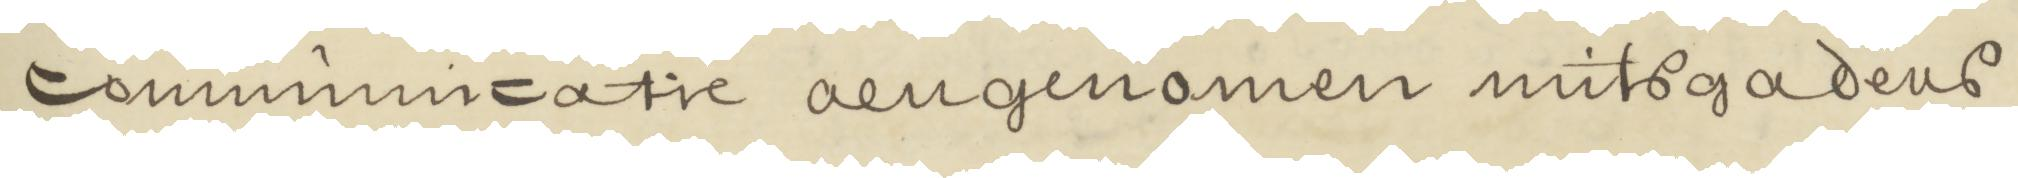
communicatie aengenomen mitsgaders
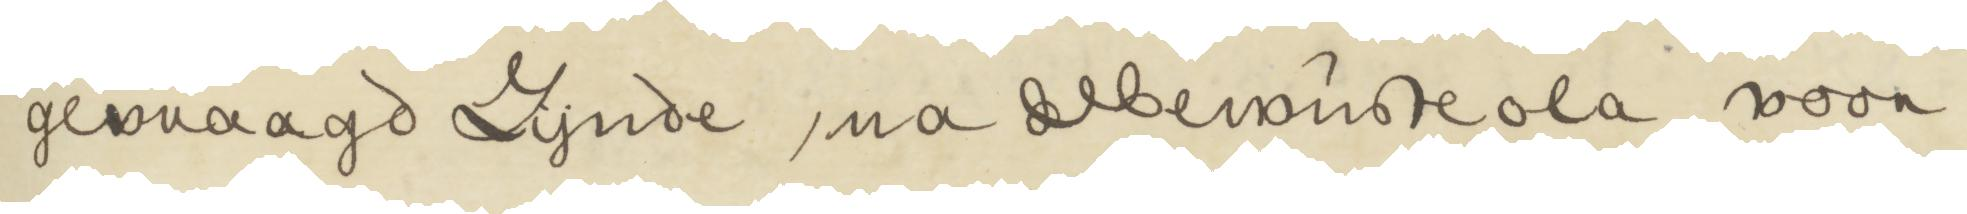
gevraagd zijnde, na debewuste ola voor
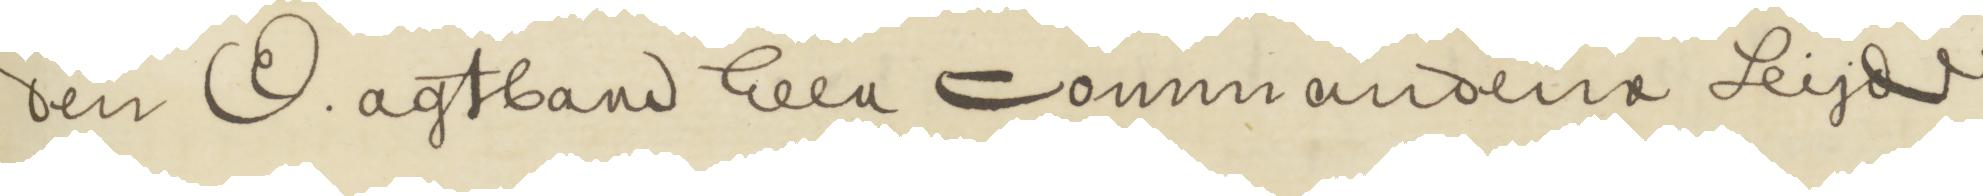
den E. agtbare heer Commandeur seijde
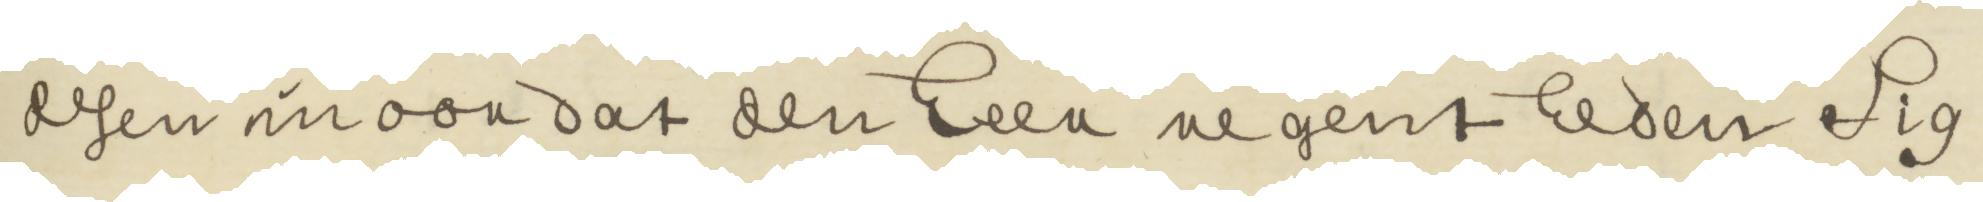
desen in oor dat den heer regent heden sig
